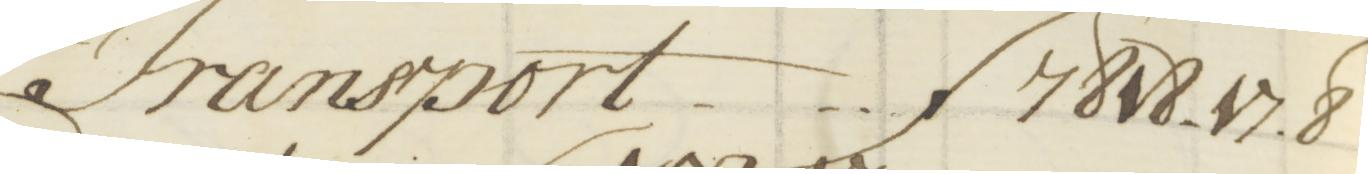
Transport ƒ 7818.17.8
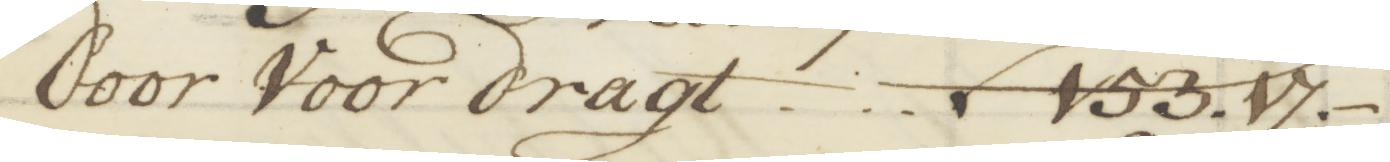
Door voor dragt ... ƒ 153.17.-
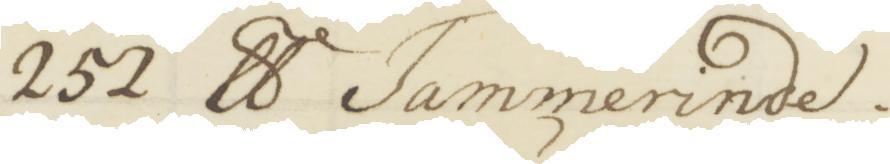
252 lb Tammerinde
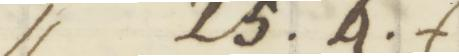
„ 25.4.-
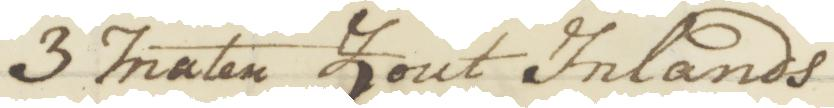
3 maten Zout Inlands
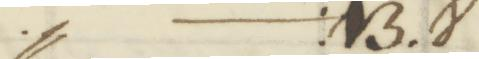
-„ —:13.8
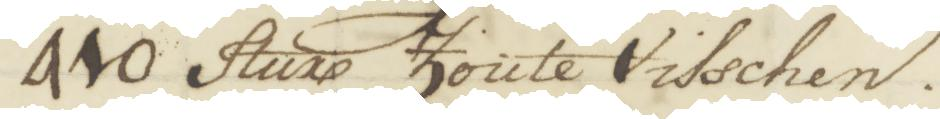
410 stux Zoute Visschen
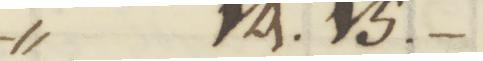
-„ 14.15.-
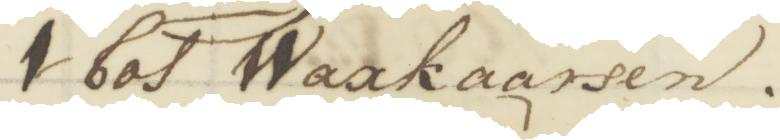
1 bos Waxkaarsen
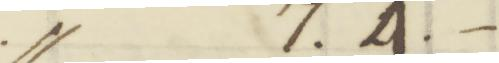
-„ 7.4.-
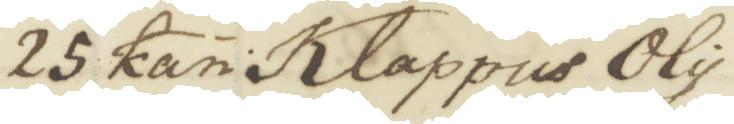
25 kan Klappus Olij
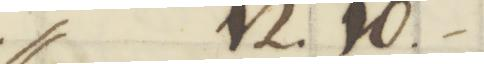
-„ 12.10.-
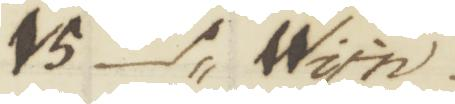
15 d„o Wijn
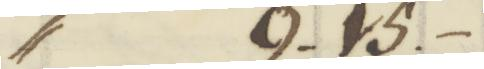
-„ 9.15.-
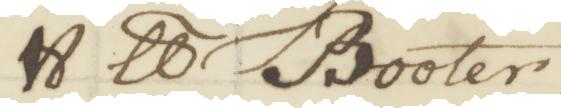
18 lb Booter
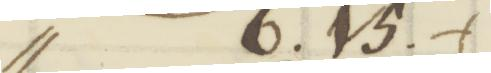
„ 6.15.-
